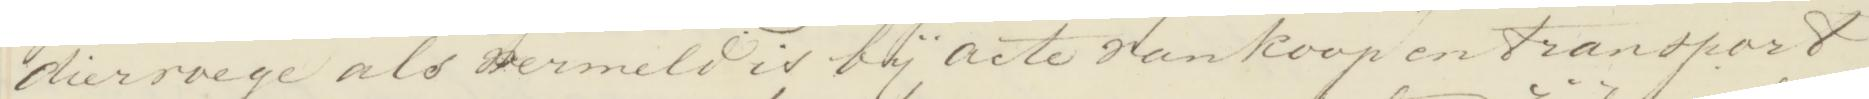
diervoege als vermeld is bij acte van koop en transport
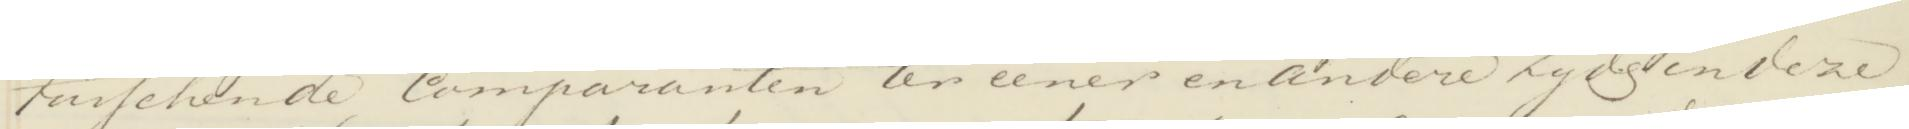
tuischende Comparanten ter eener en andere zijde in deze
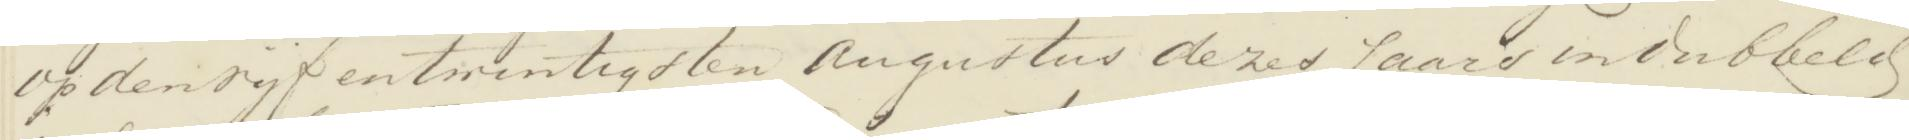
op den vijf entwintigsten Augustus dezes Jaars indubbeld
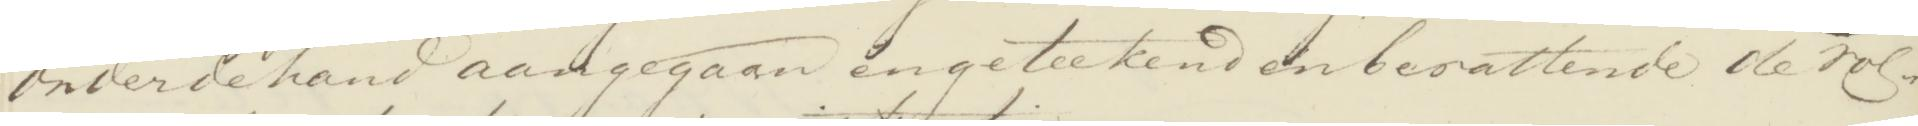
onder de hand aangegaan en geteekend en bevattende de vol„
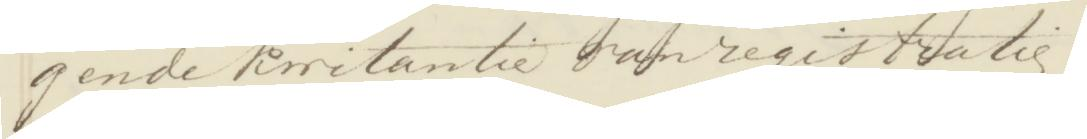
gende kwitantie van registratie
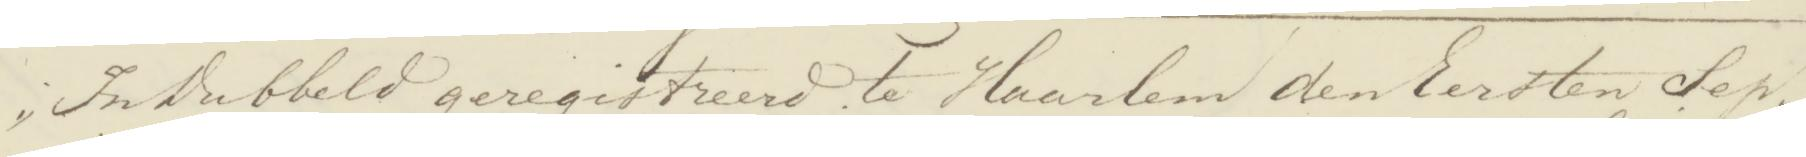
„InDubbeld geregistreerd te Haarlem den Eersten Sep„
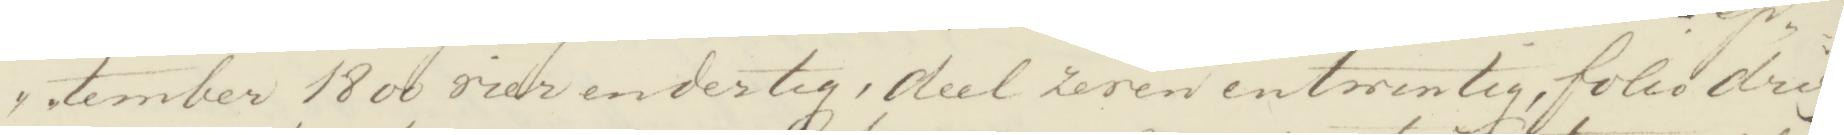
„tember 1800 vier endertig, deel zeven entwintig, folio drie
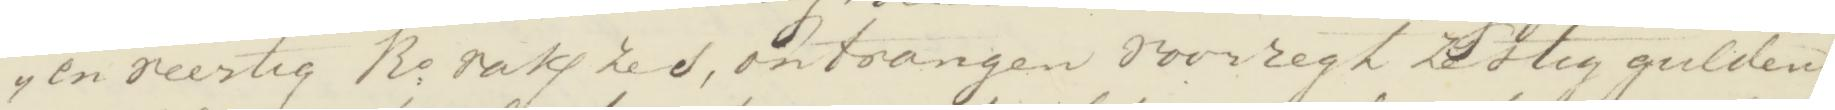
en veertig R:o vak zes, ontvangen voorregt Zestig gulden
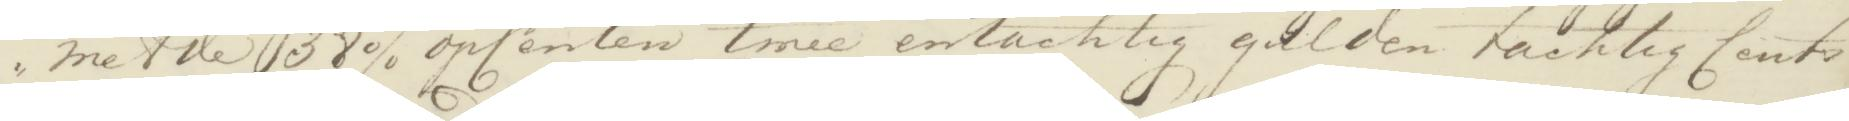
„ met de 38% opCenten twee entachtig gulden tachtig Cents
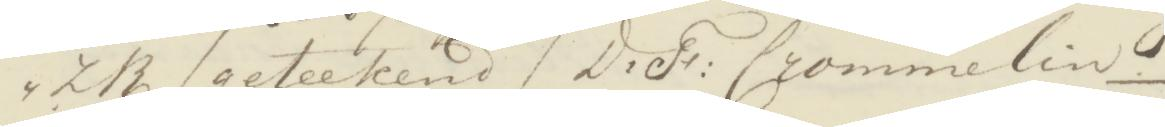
„ZR /geteekend / D: F: Crommelin
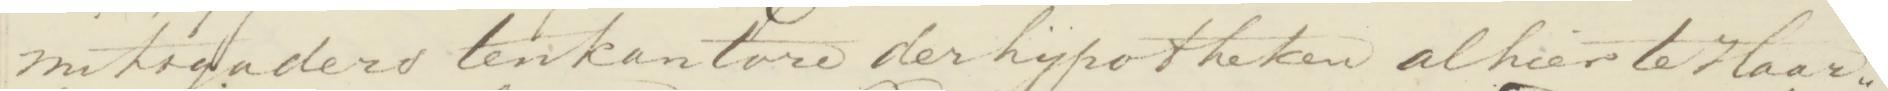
mitsgaders ten kantore derhijpotheken alhier te Haar„
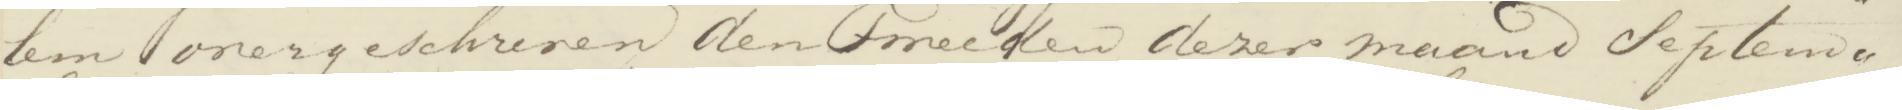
lem overgeschreven den Tweeden dezer maand Septem
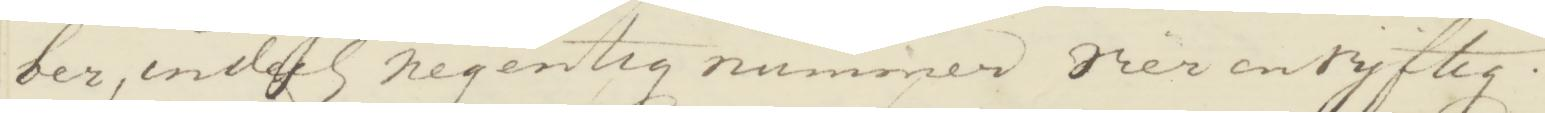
ber, indeel negentig nummer vier envijftig.
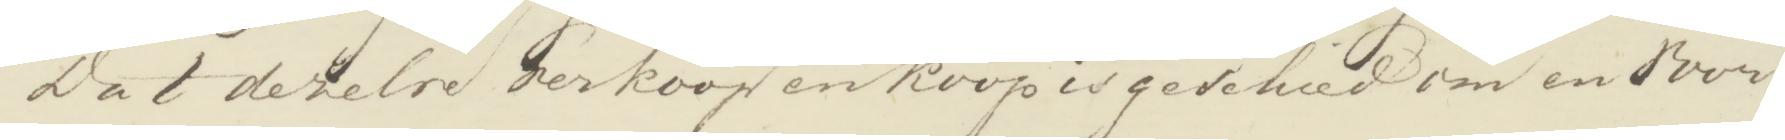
Dat dezelve verkoop en koop is geschied om en voor
